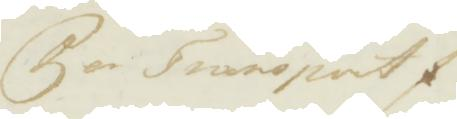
Per Transport ƒ
